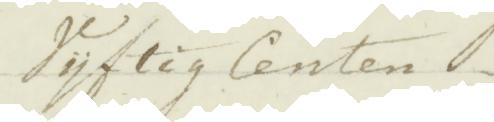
Vijftig Centen . . . . . . . . . . . . . . . . . . „ 5.50.
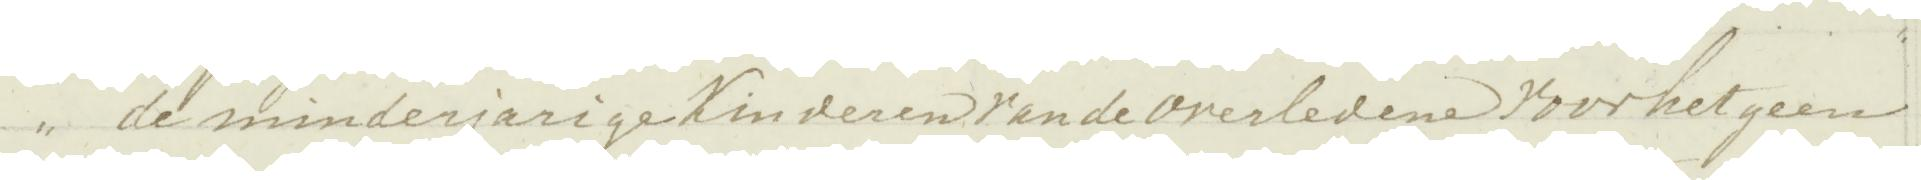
„ de minderjarige kinderen van de overledene voor het geen
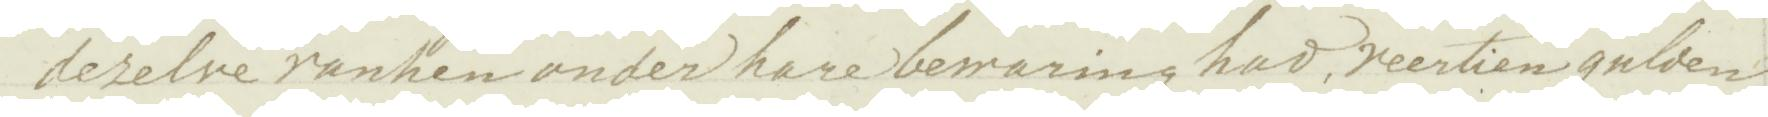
dezelve van hen onder hare bewaring had, veertien gulden 14. —
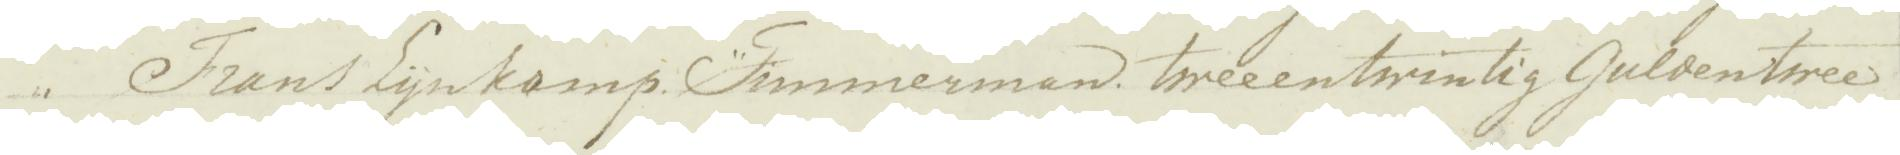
„ Frans Lijnkamp Timmerman. twee en twintig Gulden twee
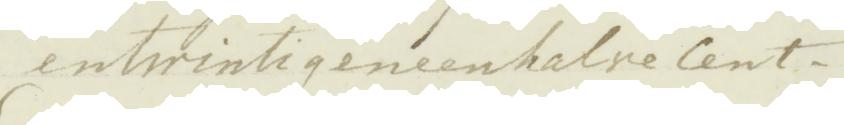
en twintig en een halve Cent . . . . . . . . . . . . . . . . „ 22„22½
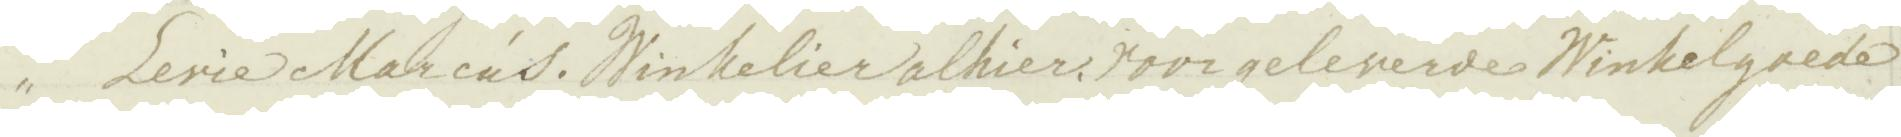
„ Levie Marcus. Winkelier alhier. voor geleverde winkelgoede
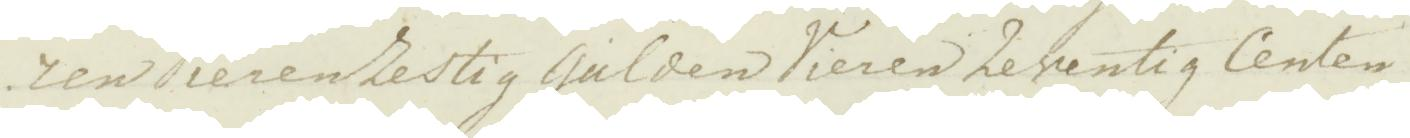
.ren Vierenzestig gulden Vieren Zeventig Centen . . . . „ 64. 74.
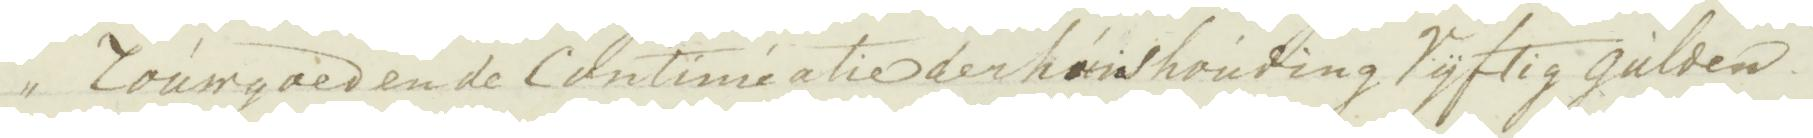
„ rouwgoed en de Continiuatie der houshouding Vijftig gulden . . „ 50. —
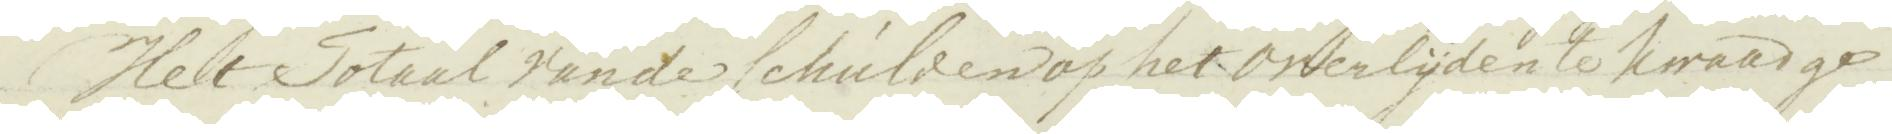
Het Totaal van de schulden op het overlijden te kwaad ge.
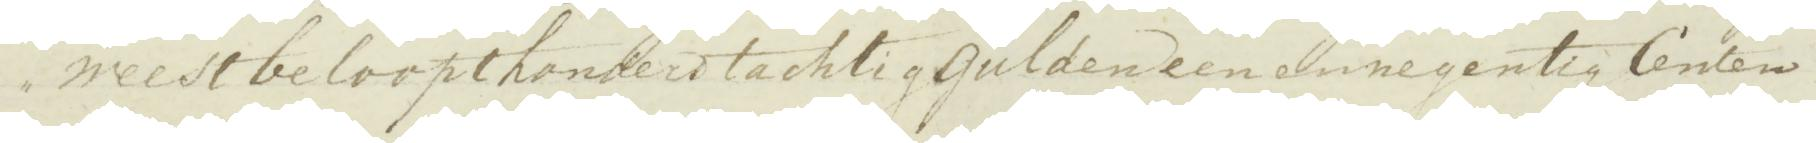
„weest beloopt honderd tachtig gulden een en negentig Centen . ƒ 180:91.
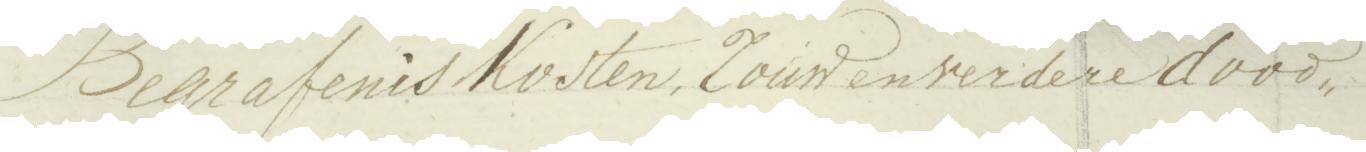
Begrafenis Kosten, rouw en verdere dood„
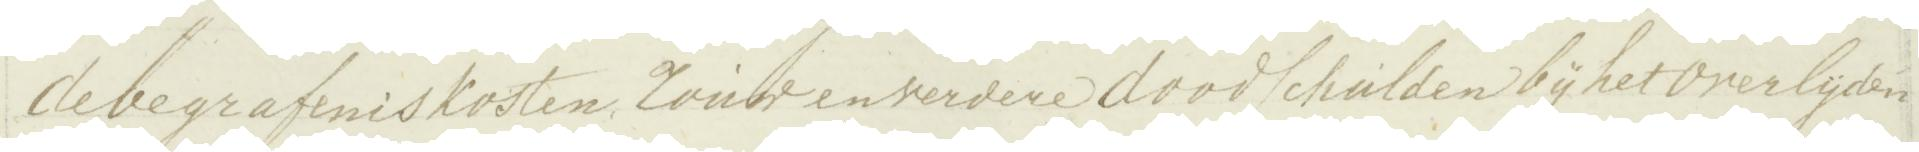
de begrafenis kosten rouw en verdere doodschulden bij het overlijden
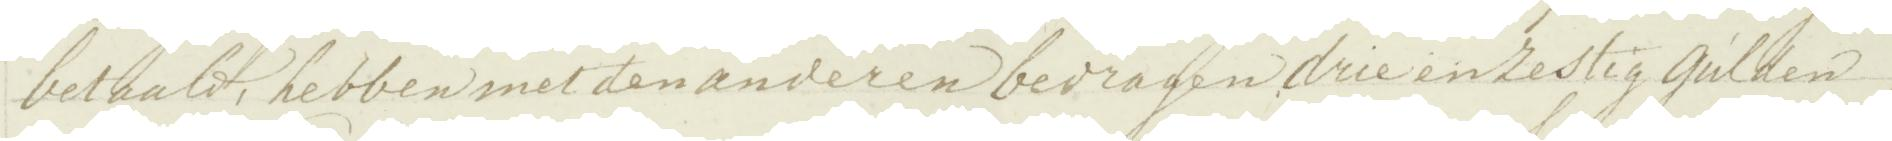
betaald, hebben met den anderen bedragen drie en zestig gulden ƒ 63. —
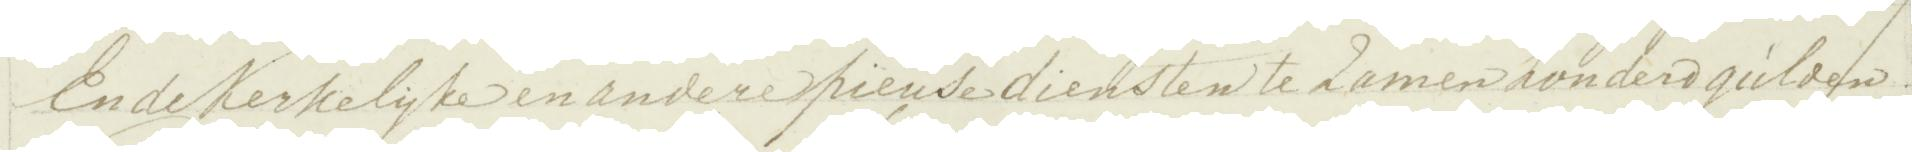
En de Kerkelijke en andere pieuse diensten te Zamen honderd gulden . 100: —
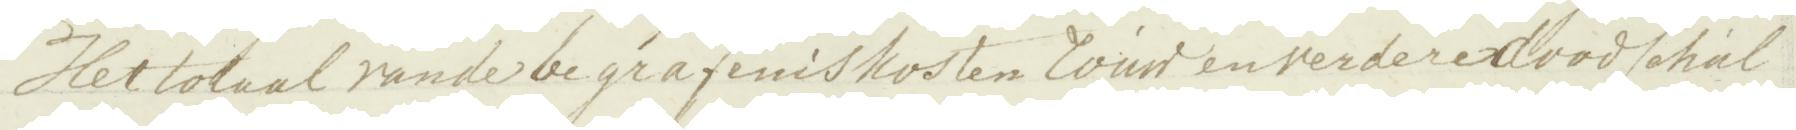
Het totaal vande begrafeniskosten rouw en verdere doodschul
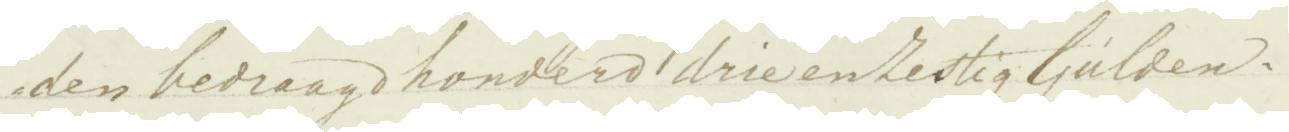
„den bedraagd honderd drie en Zestig Gulden . . . . . . . . ƒ163: —
